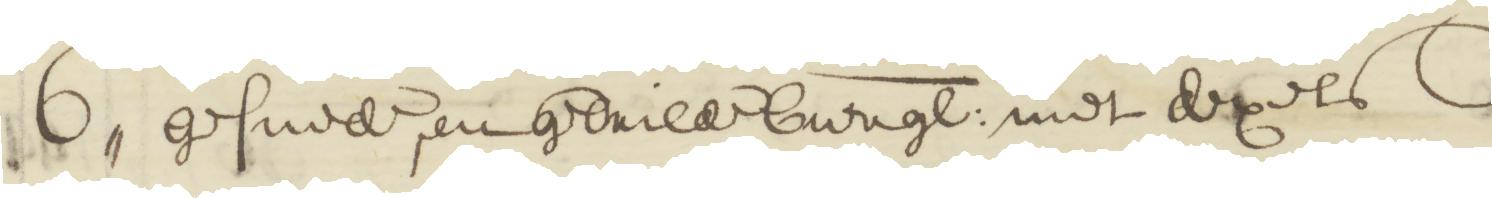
6 „ gesnede, en gedrilde biergl: met dexels
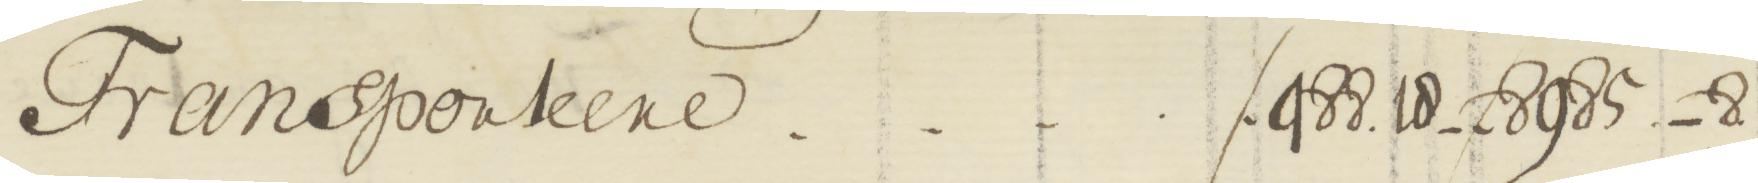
Transporteere - - - - ƒ 488. 18 — ƒ 8985. — 8.
